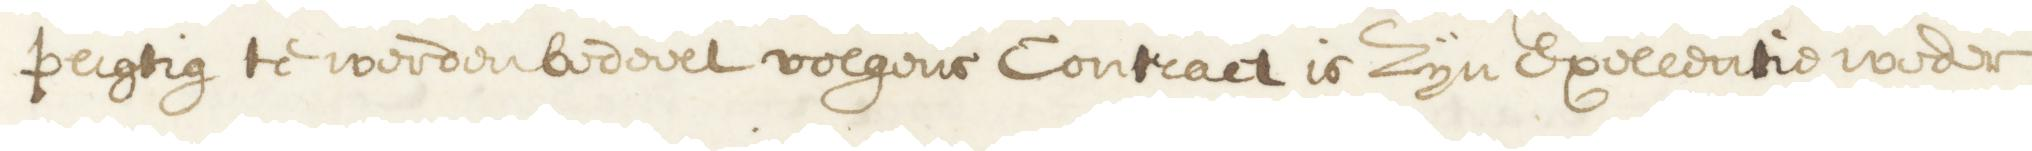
pligtig te werden bedeelt volgens Contract is zijn Exellentie weder
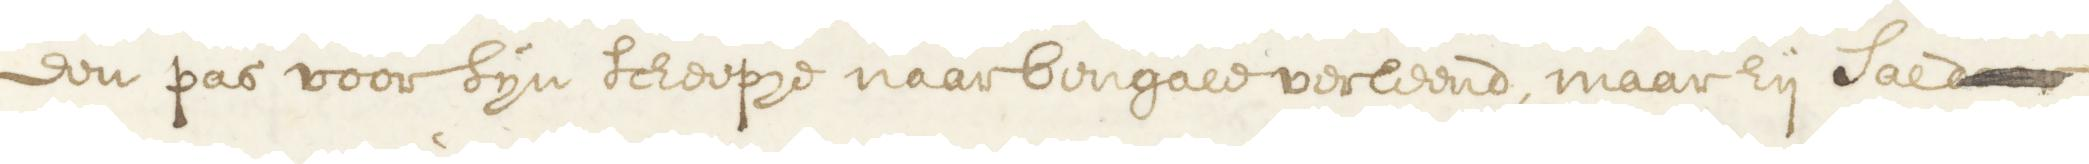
een pas voor sijn scheepje naar bengale verleend, maar hij sald
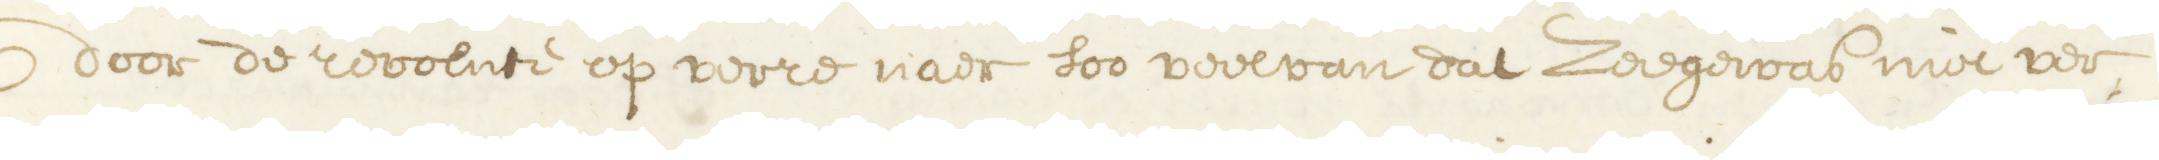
door de revolute op verre naer soo veelvan dat zeegewas niet ver„
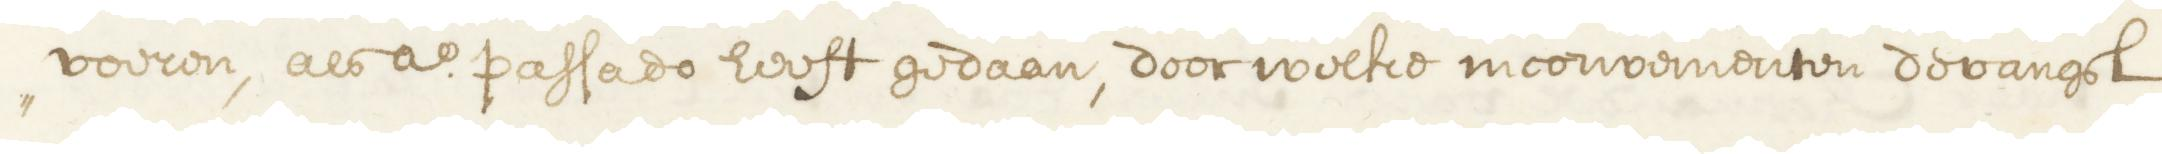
„voeren, als a:o passado heeft gedaan, door welke inconveinenten devangst
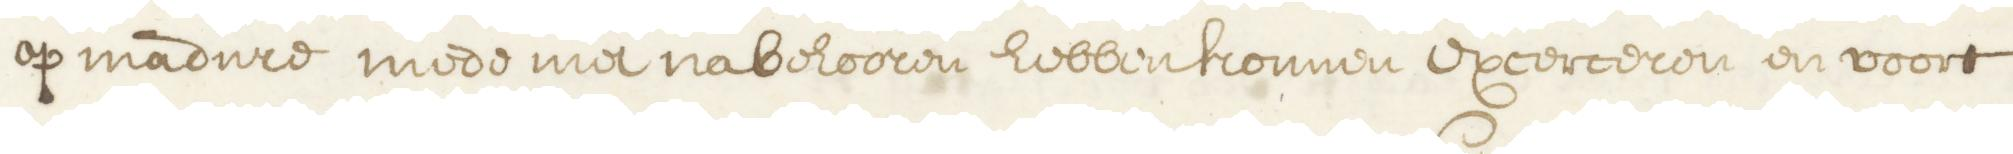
op madure mede niet na behooren hebben konnen excerceren en voort
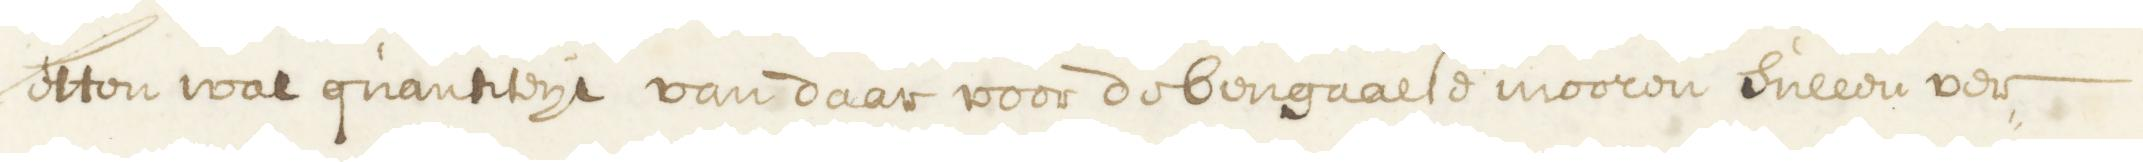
setten wat quantiteijt van daar voor debengaalse mooren sullen ver„
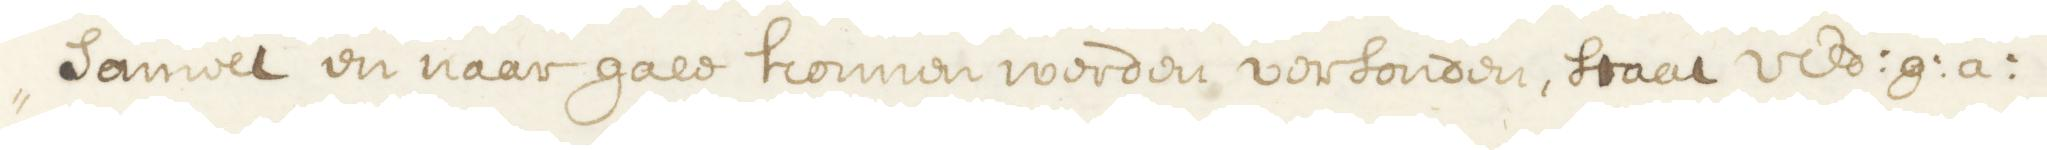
„samelt en naar gale konnen werden versonden, staat VEd: g: a:
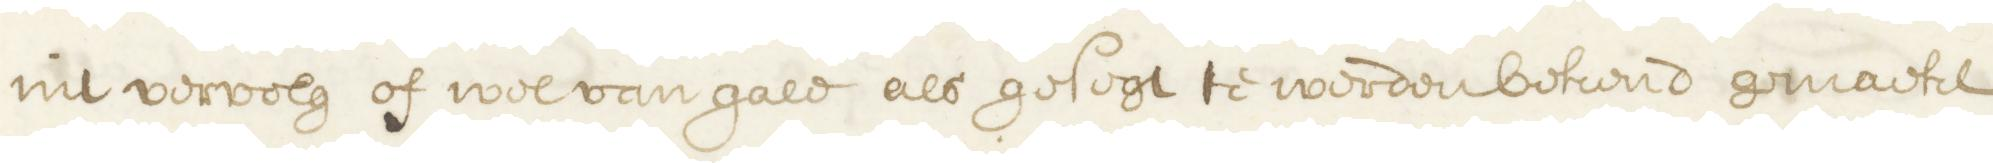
int vervolg of wel van gale als gesegt te werden bekend gemaekt
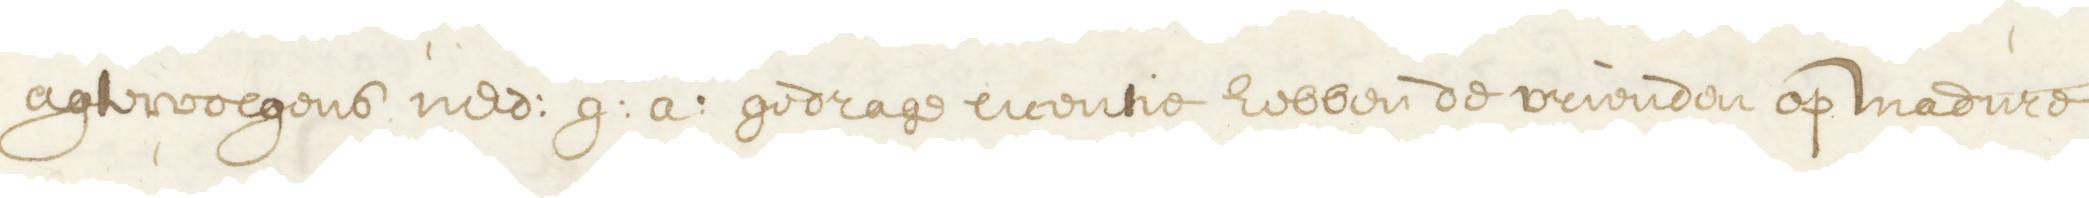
agtervolgens uEd: g: a: gedrage licentie hebben de vrienden op madure
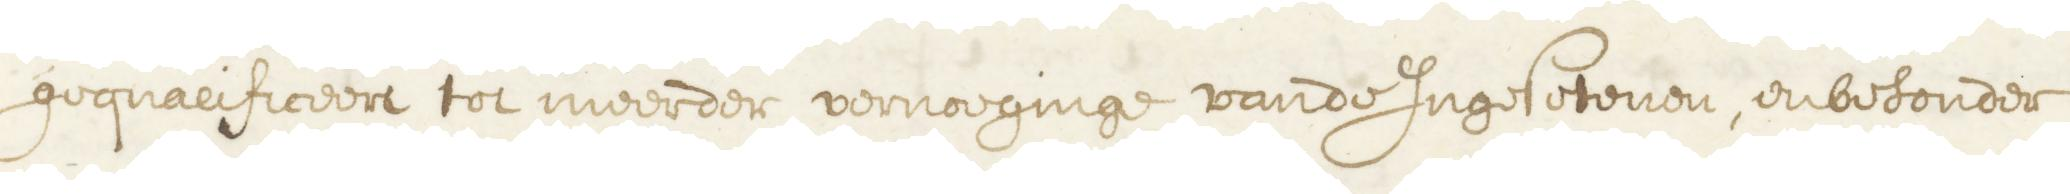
gequalificeert tot meerder vernoeginge vande Jngesetenen, en besonder
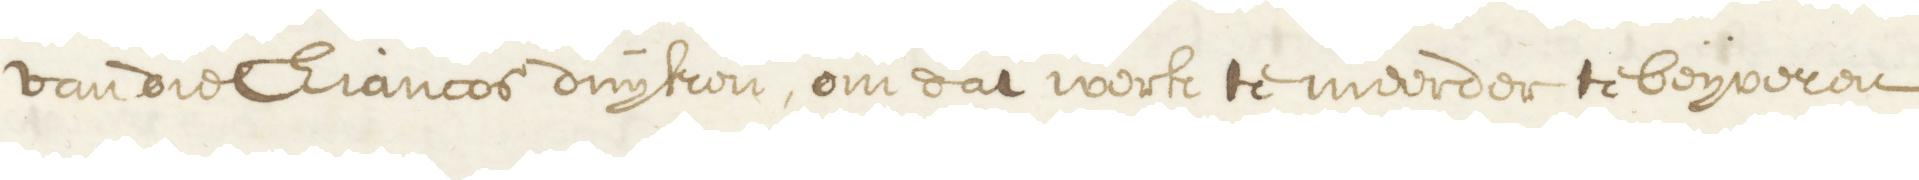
van die Chiancos duijken, om dat werk te meerder te beijveren
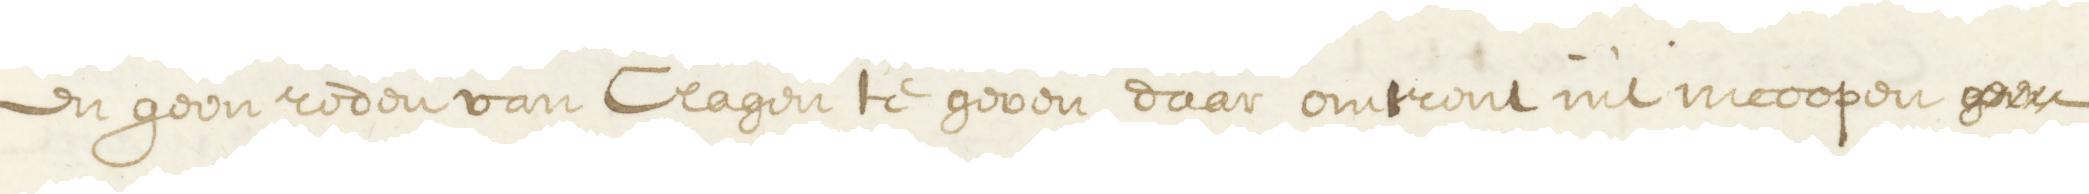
en geen reden van Clagen te geven, daar omtrent in't incoopen geen
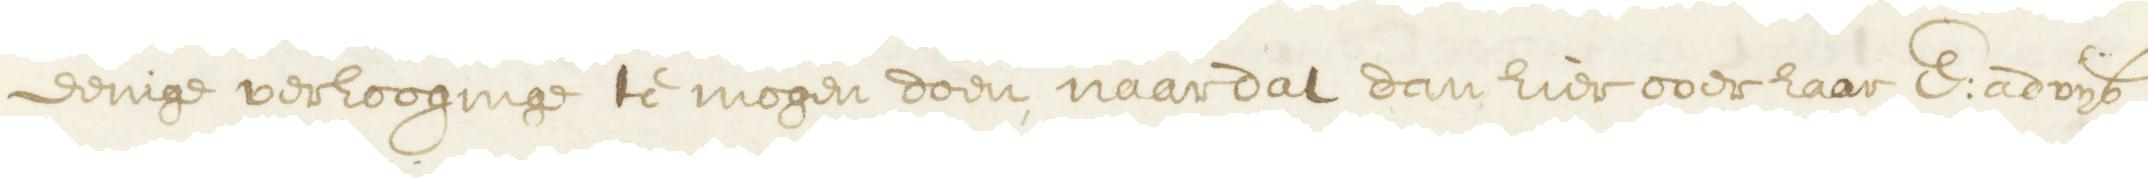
eenige verhooginge te mogen doen, naardat dan hier over haar E: advijs
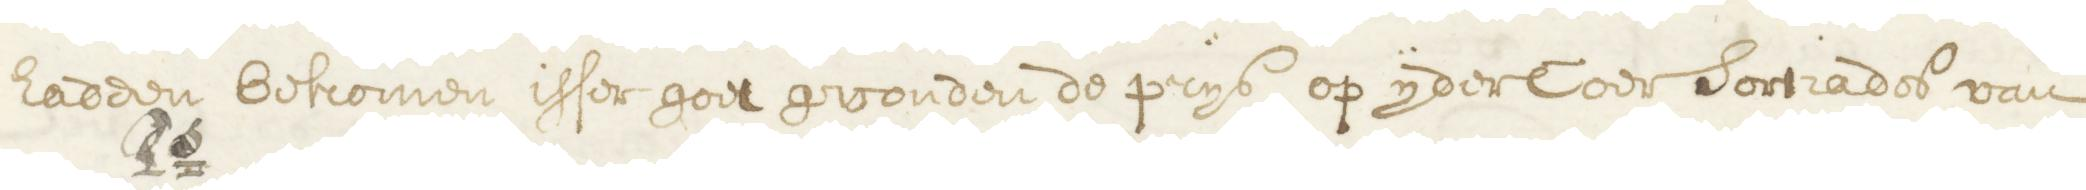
hadden bekomen isser goet gevonden de prijs op ijder Coer sortiados van
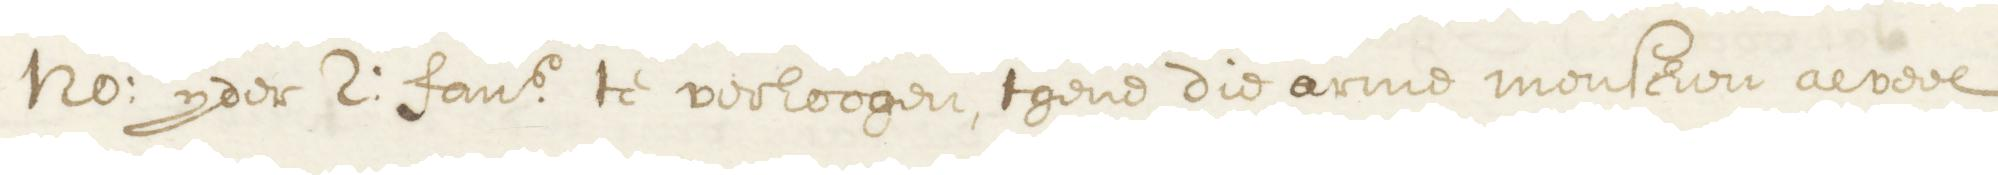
120: F=s ijder 2: fan.s te verhoogen, 'tgene die arme menschen alveel
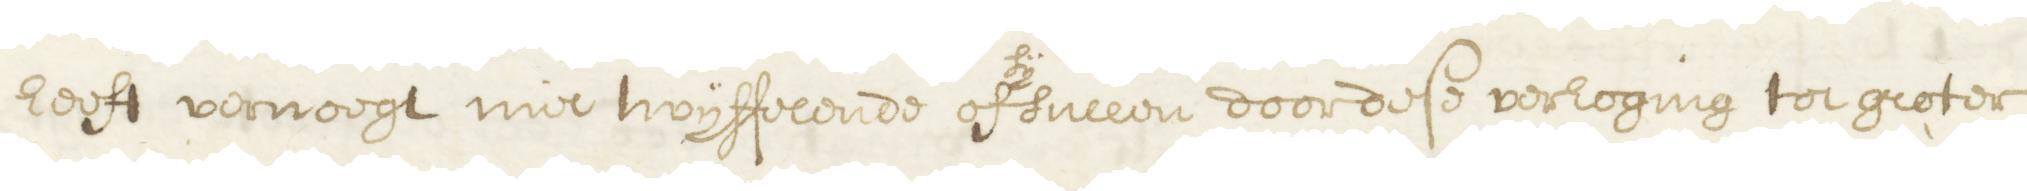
heeft vernoegt niet twijffelende of sij sullen door dese verhoging tot groter
